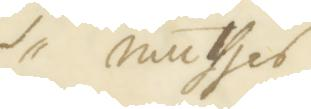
_„ mutsjes
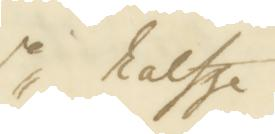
_„ halfje
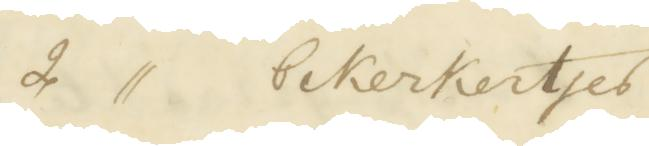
2 „ bekerkertjes
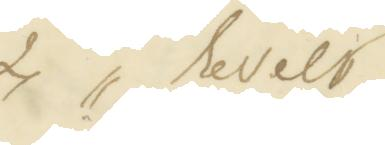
4 „ hevels
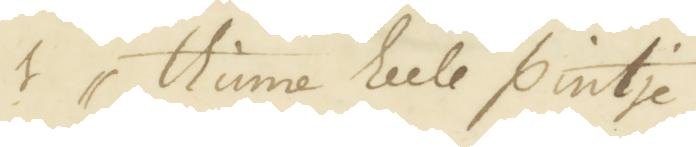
1 „ thinne heele pintje
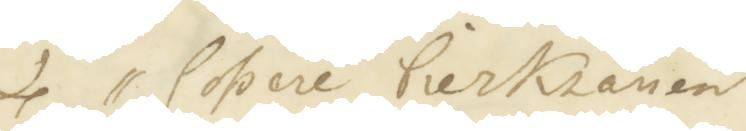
4 „ Copere sierkranen
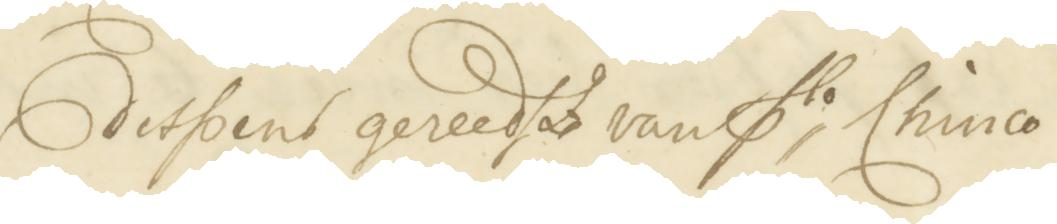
dispens gereedsz van p„lo Chinco
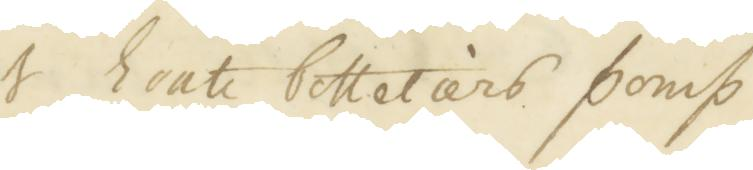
1 houte botteliers pomp
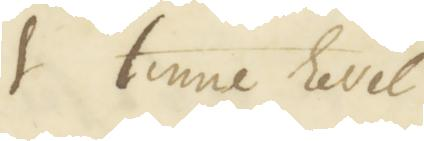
1 tinne hevel
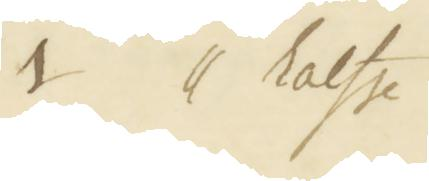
1„ halfje
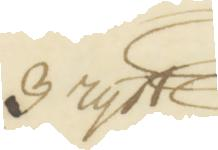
3 ryst
